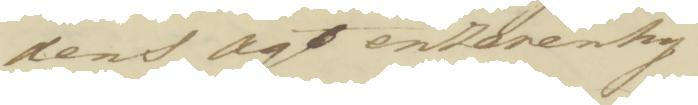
dens agt en zeventig
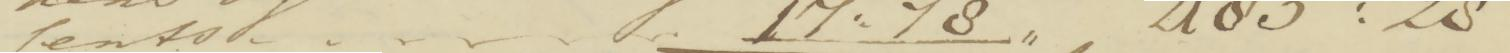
Cents 17: 78 „ 485 : 28
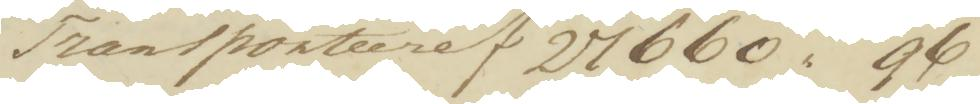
Transporteere ƒ 27660 „ 96
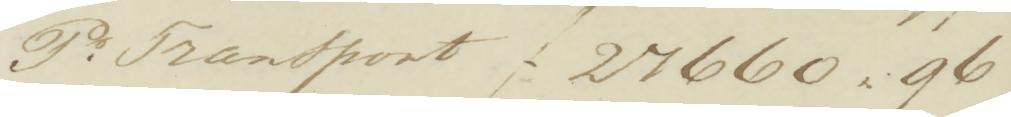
P.r Transport ƒ 27660 „ 96
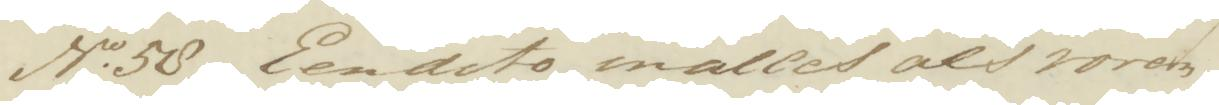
N.o 58 Een dito inalles als voren
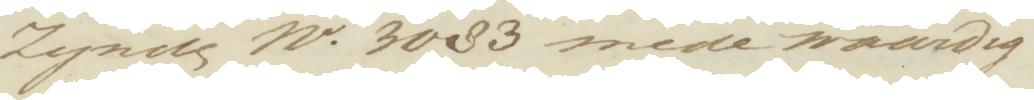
Zynde N.o 3083 mede waardig
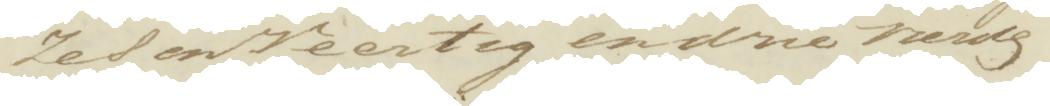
Zes en Veertig en drie vierde
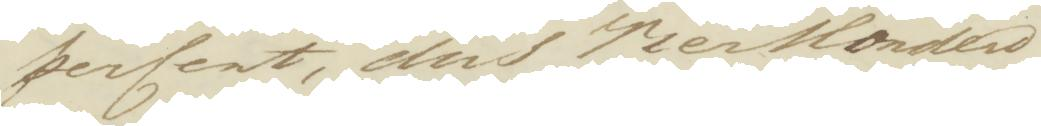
percent, dus Vier Honderd
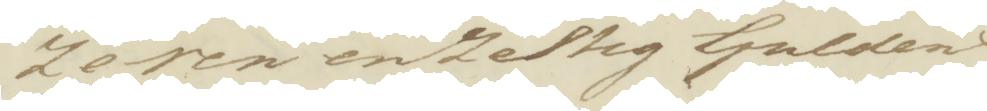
Zeven en Zestig Gulden
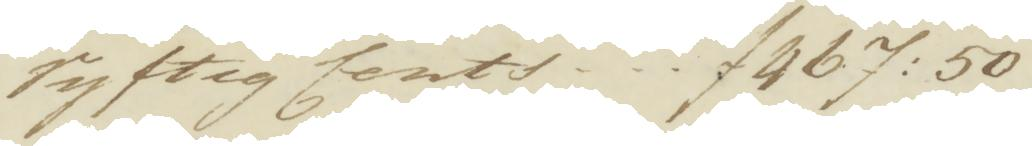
Vijftig Cents ... ƒ467: 50
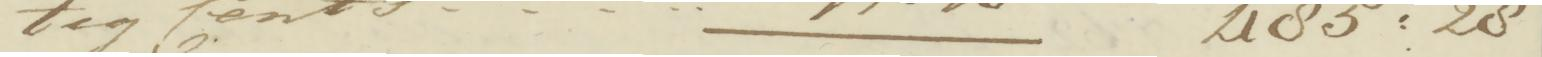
tig Cents . 17: 78 485 : 28
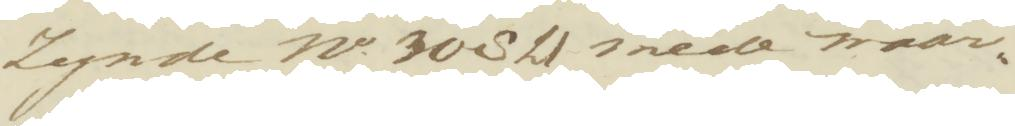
Zynde n.o 3084 mede waar„
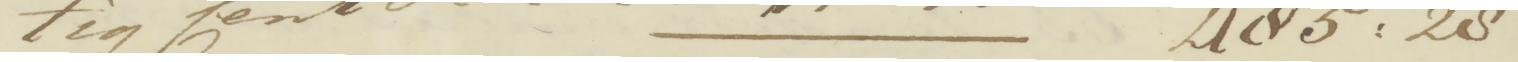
tig Cents . . 17 : 78 485 : 28
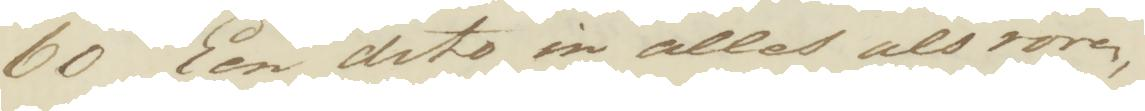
60 Een dito in alles als voren,
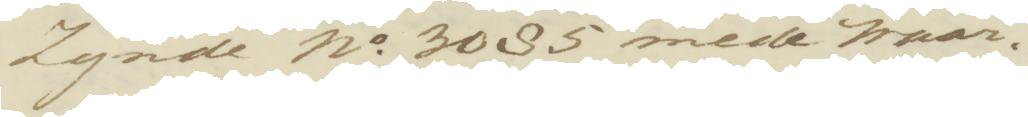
Zynde no. 3085 mede waar„
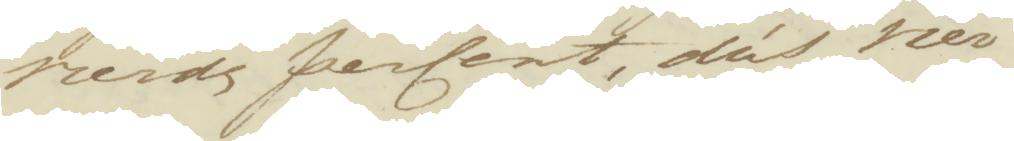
vierde percent, dus vier
